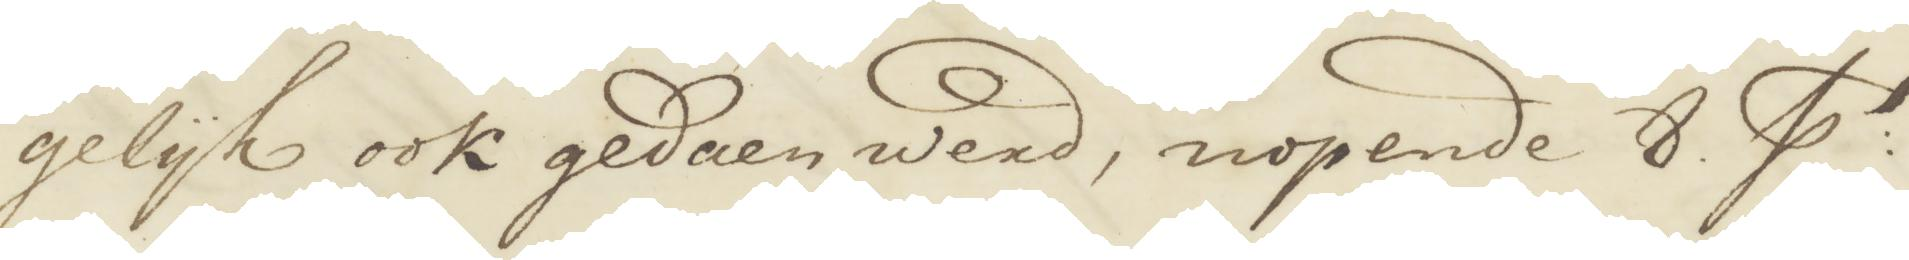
gelijk ook gedaen werd, nopende 8. p:s
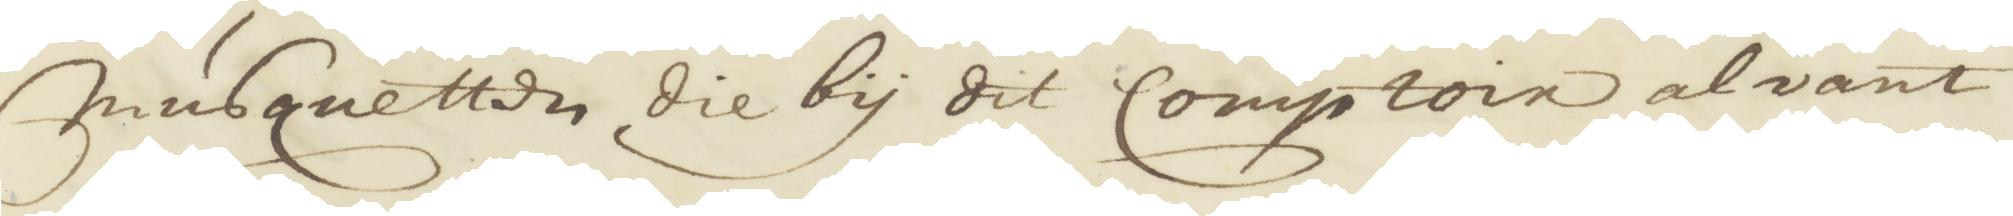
musquetten die bij dit Comptoir alvan't
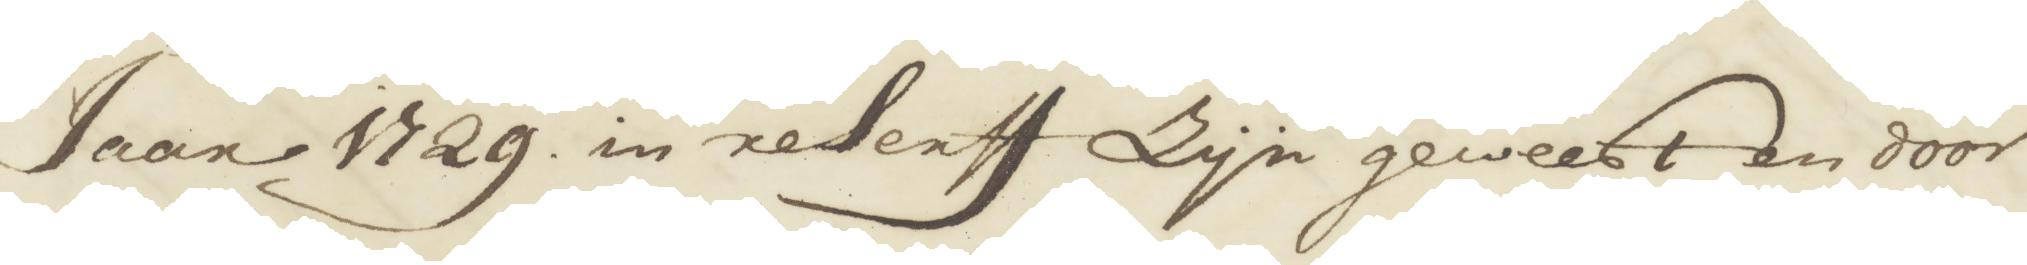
Iaar 1729. in reserff zijn geweest en door
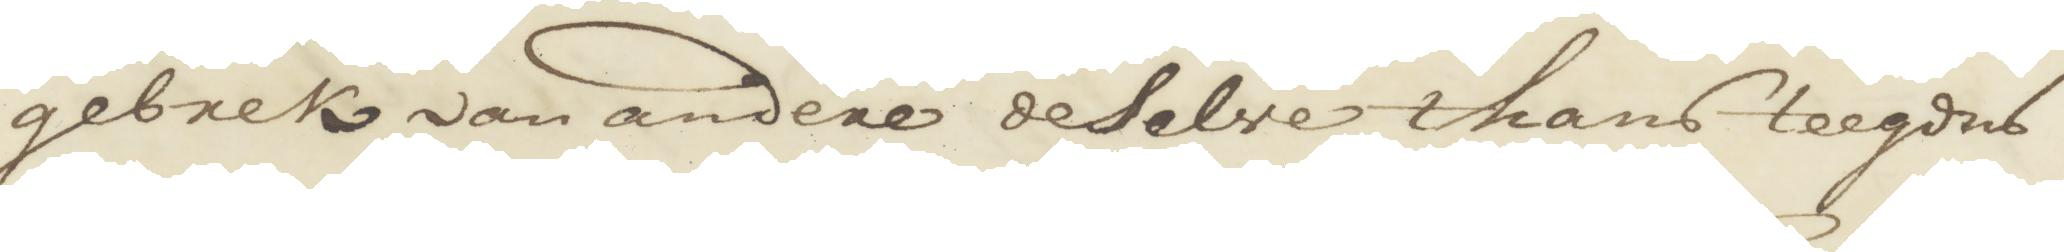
gebrek van andere deselve thans teegens
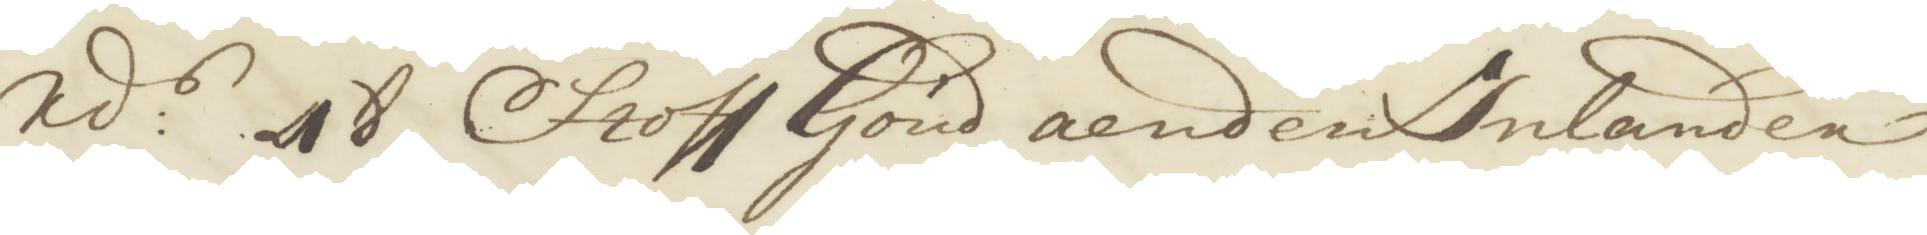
rd:s 48, Stoff Goud aenden Inlander
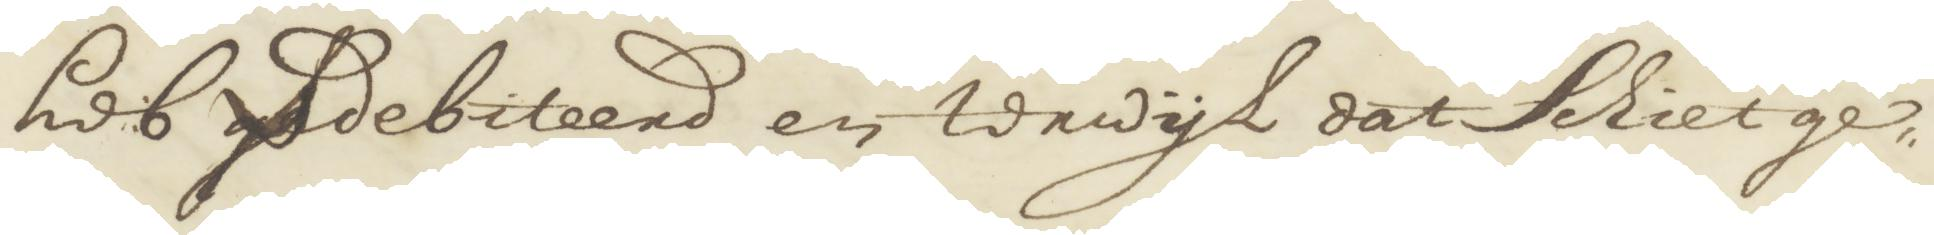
heb verdebiteerd en terwijl dat schiet ge„
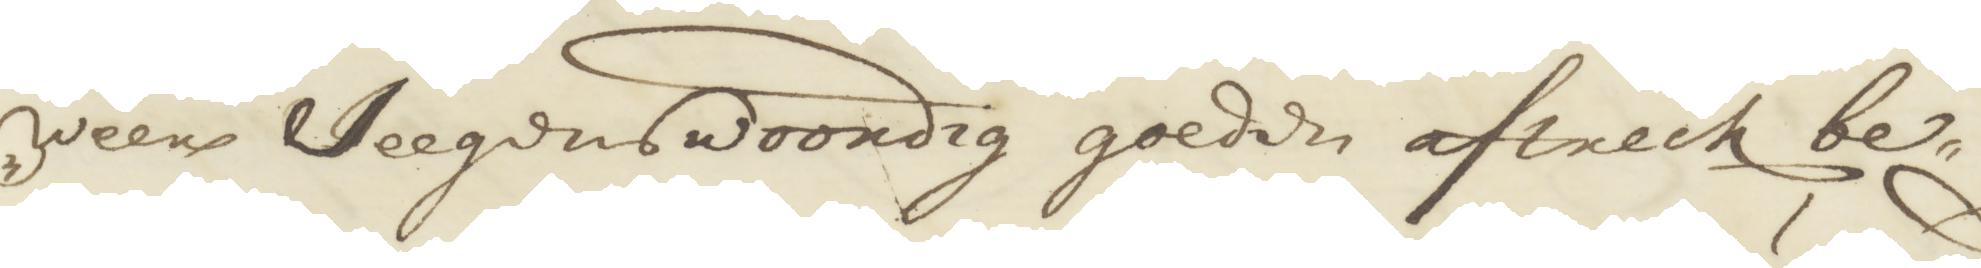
„weer teegenswoordig goeden aftreck be„
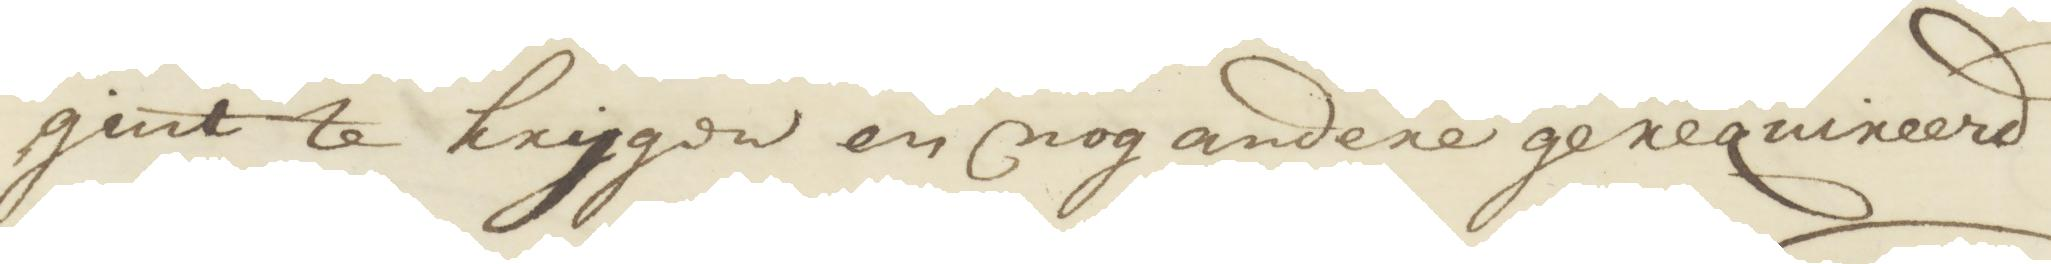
gint te krijgen en nog andere gerequireerd
